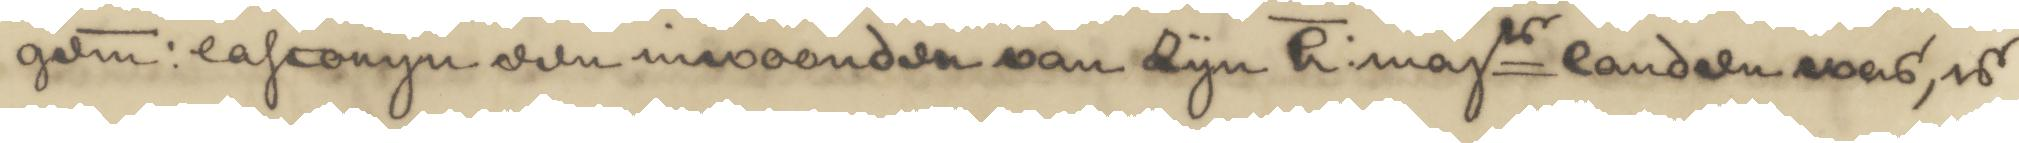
gem: lascorijn een inwoonder van zijn k: maj=ts landen was, is
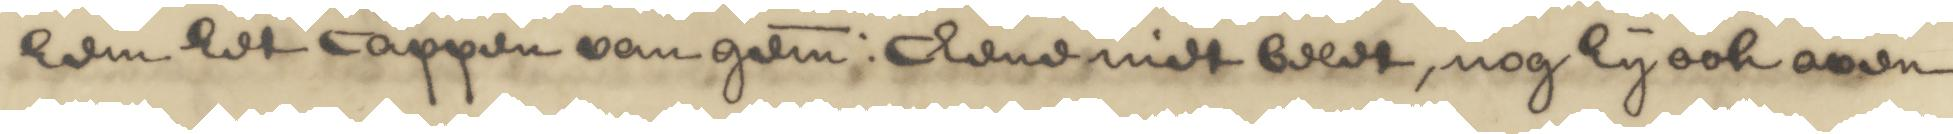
hem het cappen van gem: chene niet belet, nog hij ook over
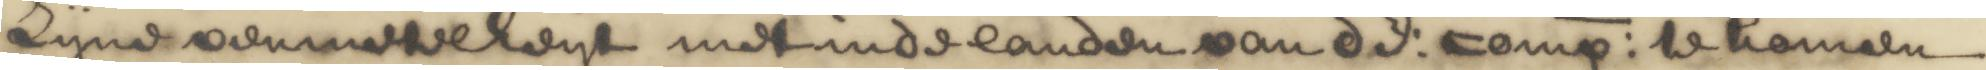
zijne vermetelheijt met inde landen van d'E: comp: te komen
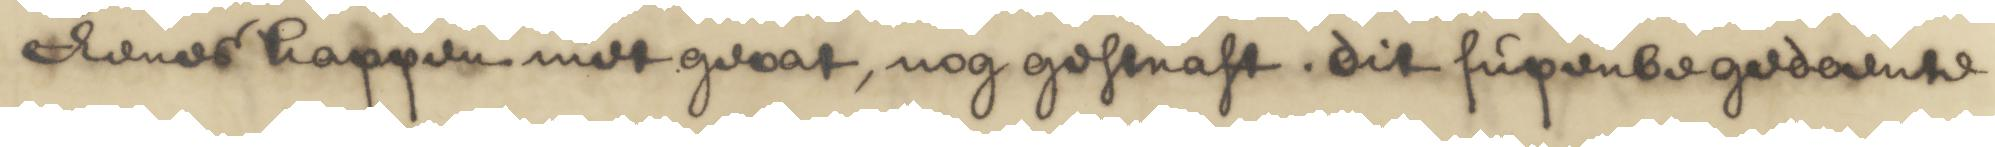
chenes kappen niet gevat, nog gestraft. dit superbe gedoente
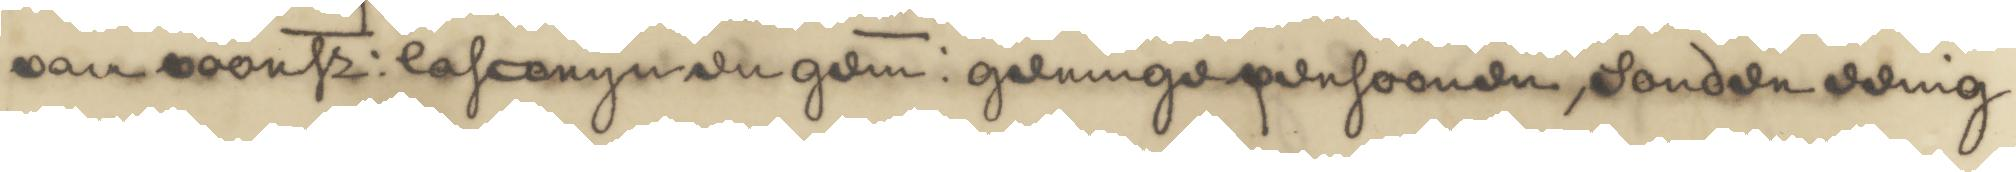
van voorsz: lascorijn en gem: geringe persoonen, sonder eenig
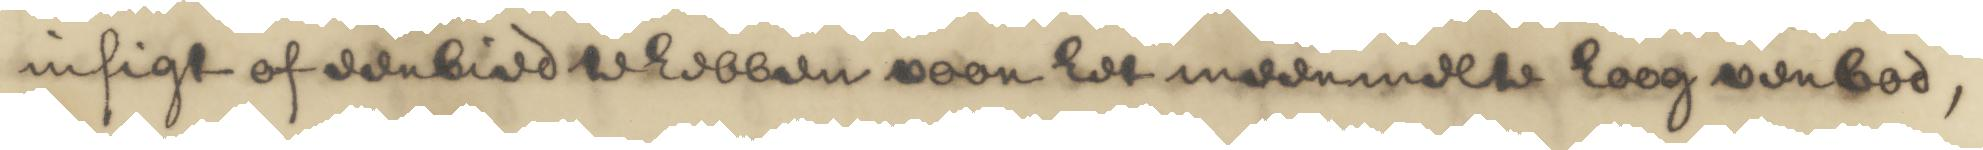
insigt of eerbied te hebben voor het meermelte hoog verbod,
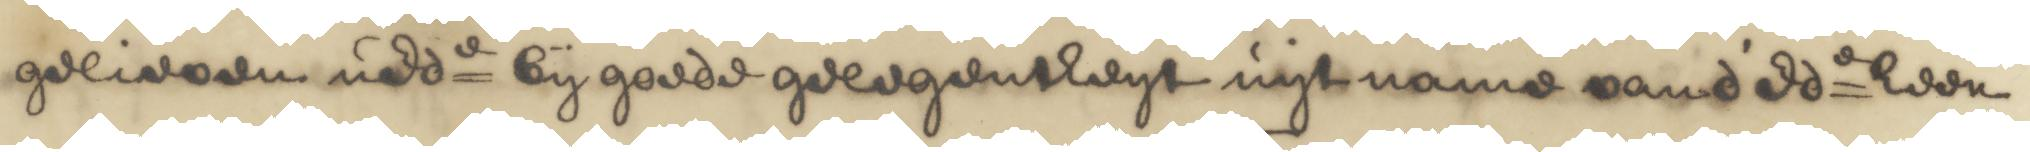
gelieven uEd=e bij goede gelegentheijt uijt name van d’ Ed=e heer
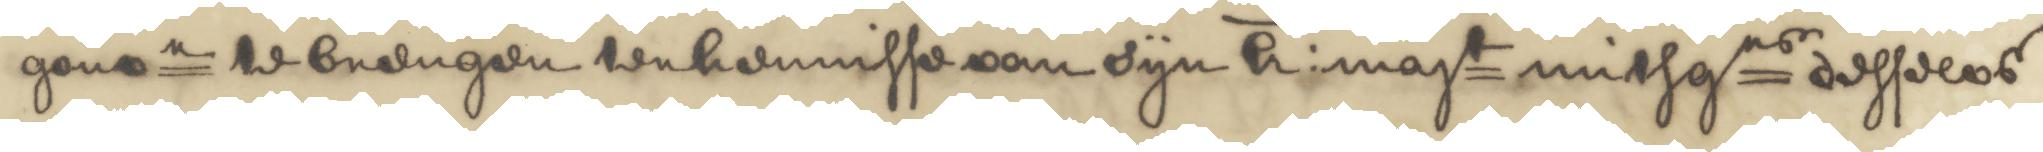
gouv=r te brengen ter kennisse van sijn k: maj=t mitsg=rs desselvs
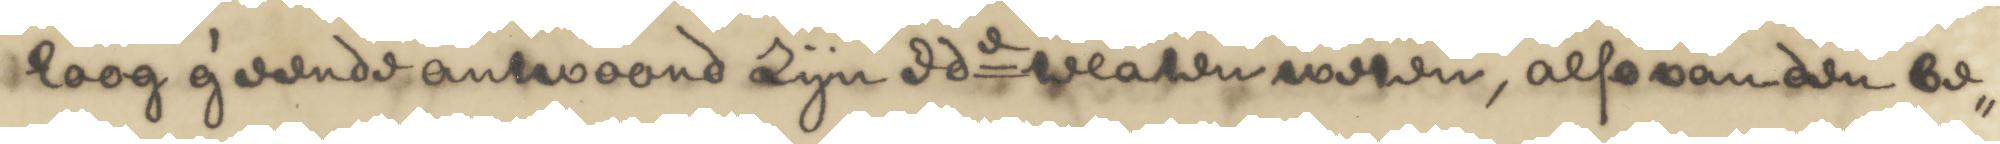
hoog g’eerde antwoord zijn Ed=e telaten weten, also van den be„
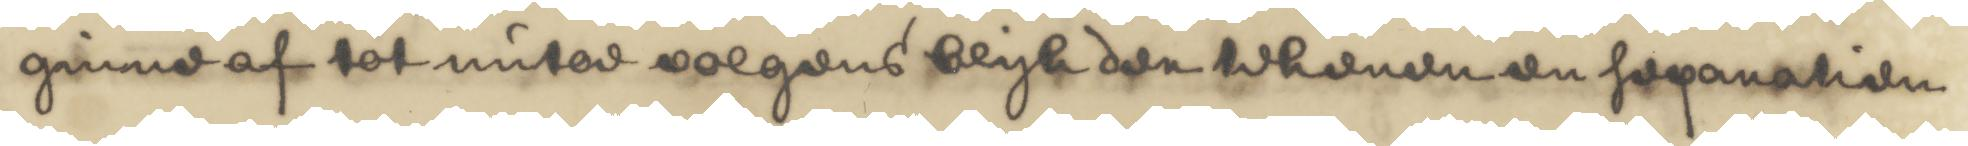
ginne af tot nutoe volgens blijk der tekenen en separatien
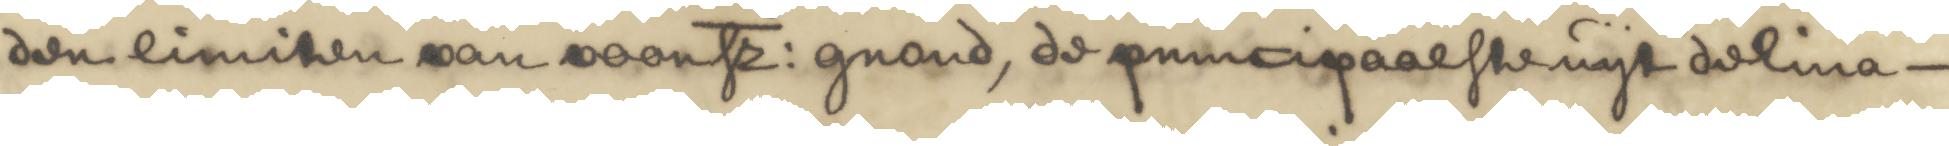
der limiten van voorsz: grond, de principaalste uijt de hina —
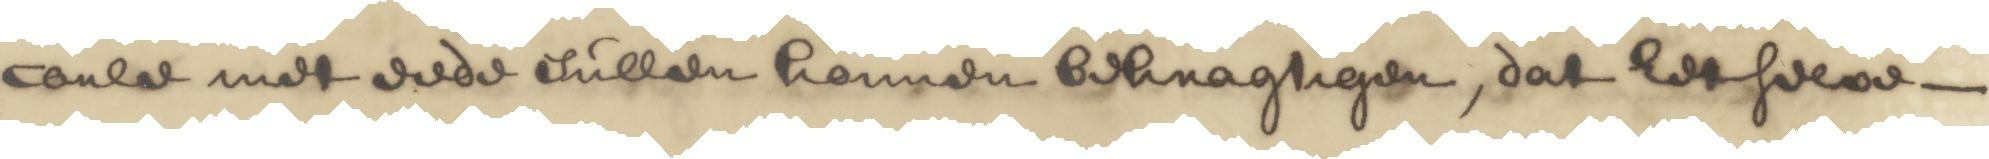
corle met eede sullen konnen bekragtigen, dat het selve —
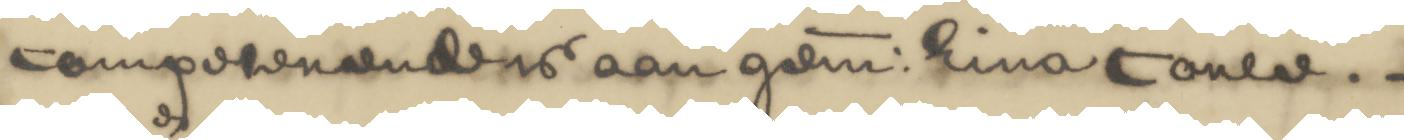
competerende is aan gem: hina corle.
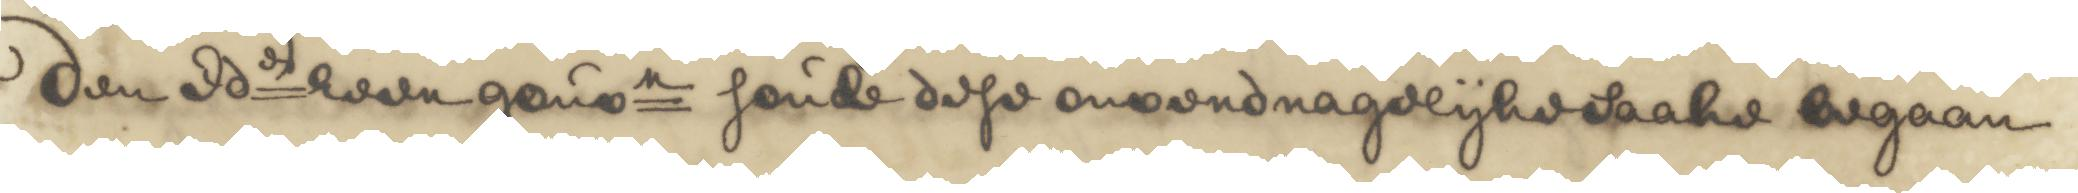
den Ed=en heer gouv=r soude dese onverdragelijke saake begaan
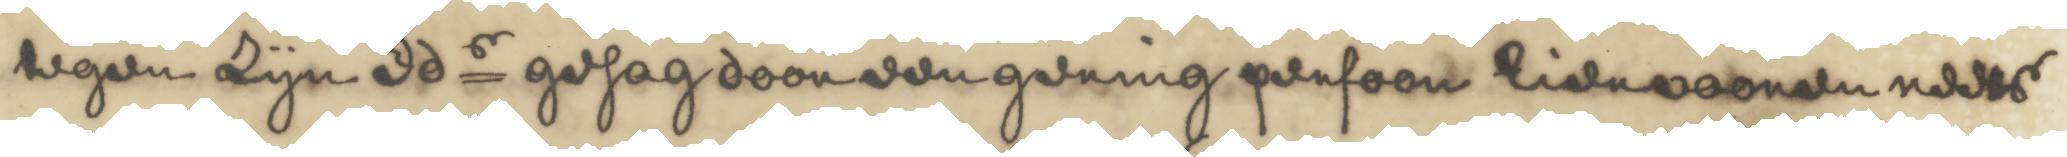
tegen zijn Ed=s gesag door een gering persoon hiervooren reets
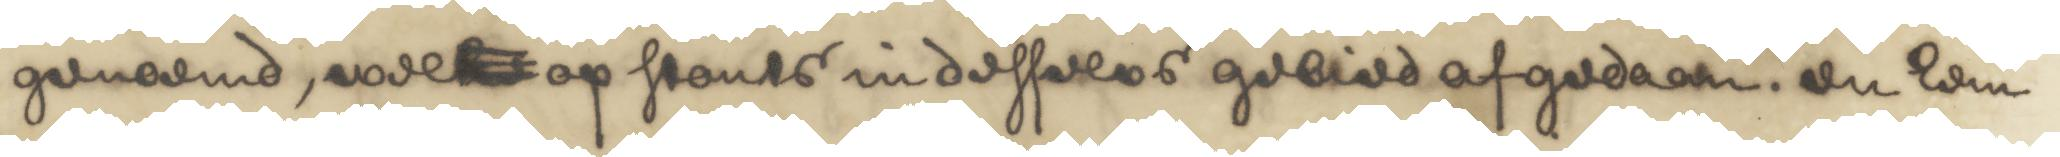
genoemd, welk op stonts in desselvs gebied afgedaan, en hem
